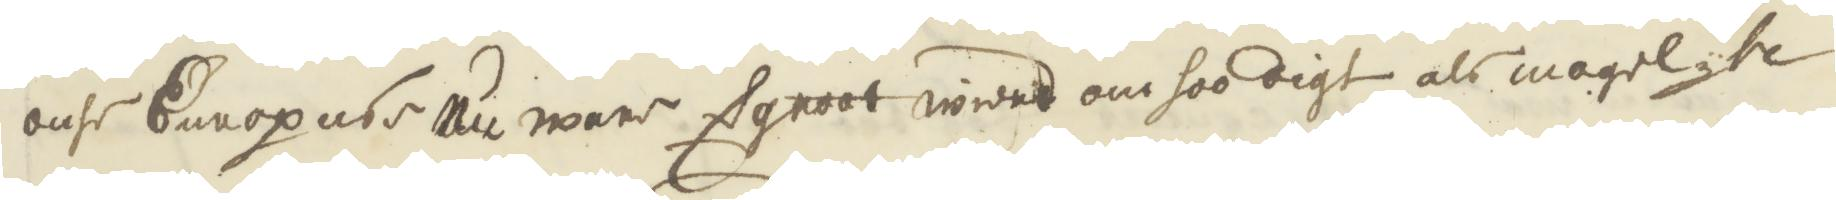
onse Europeese nu ware vergroot wierd om soo digt als mogelijk
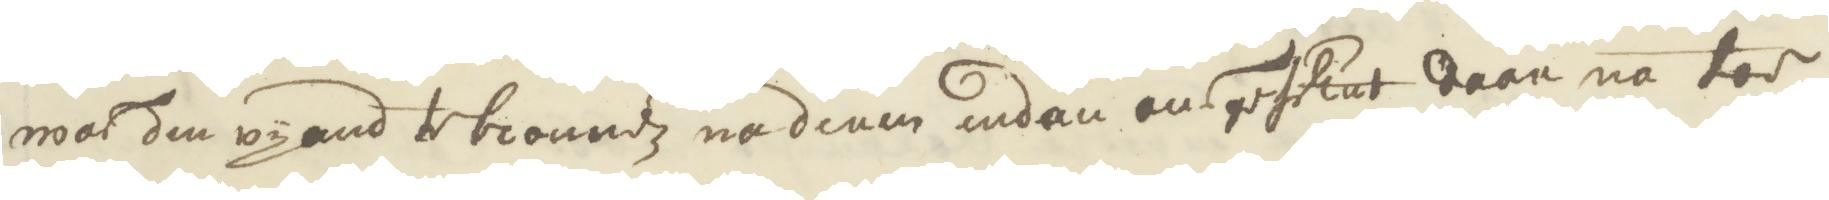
was den vijand te konnen naderen endan ons geschut daar na toe
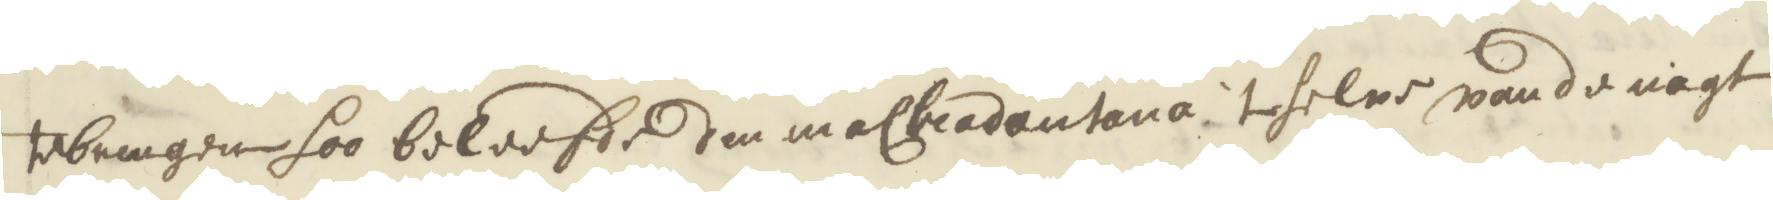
tebrengen soo beleefde den mackadantana 'tselve van de nagt
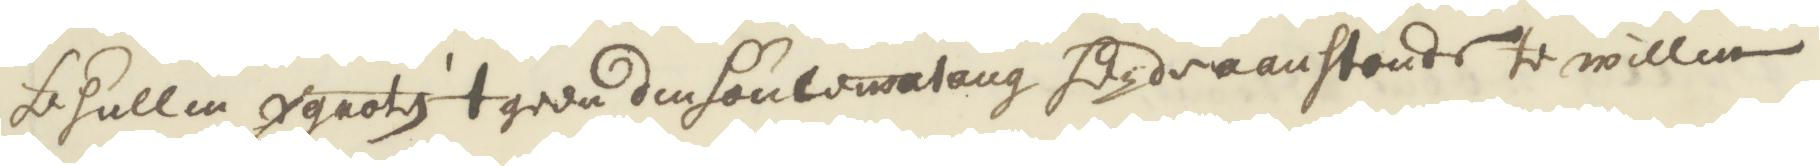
te sullen vergroten ’t geen den soutewatang seijde aanstonds te willen
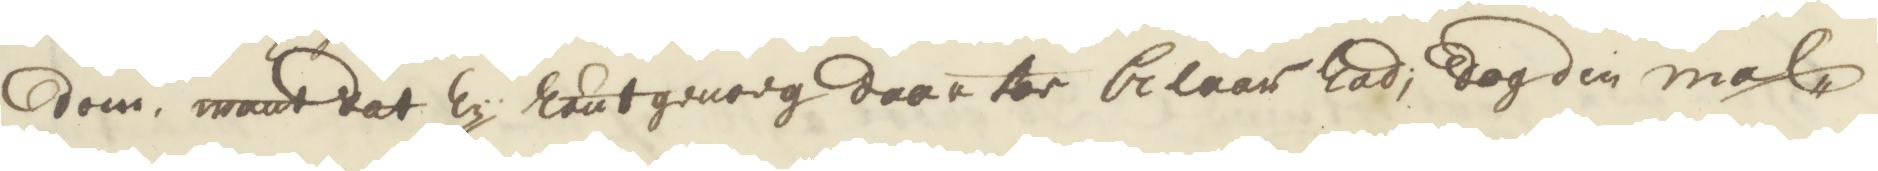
doen, want dat hij hout genoeg daar toe klaar had; dog den mac„
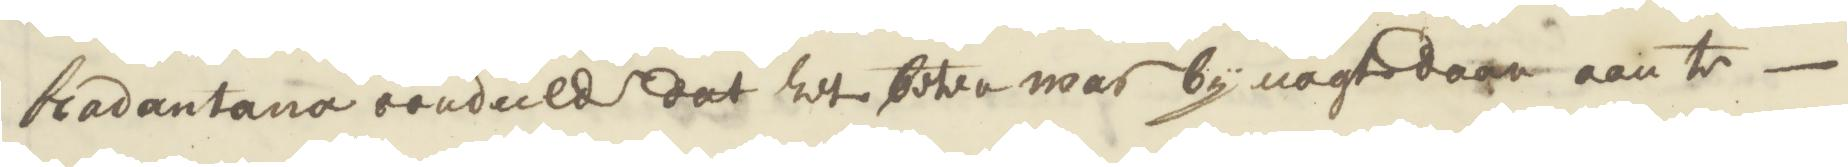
kadantana oordeelde dat het beter was bij nagt daar aan te —
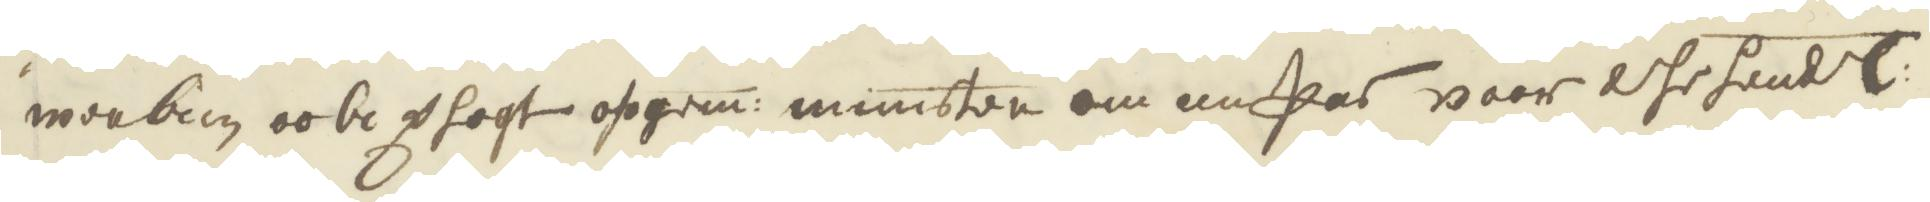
werken ook versogt opgem: minister om een pas voor dese sendel:
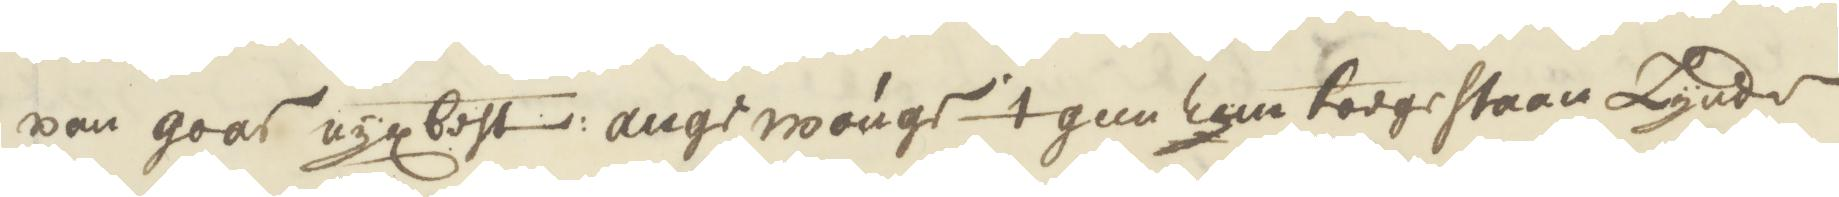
van goas rijxbest: ange wouge ’t geen hem toegestaan zijnde
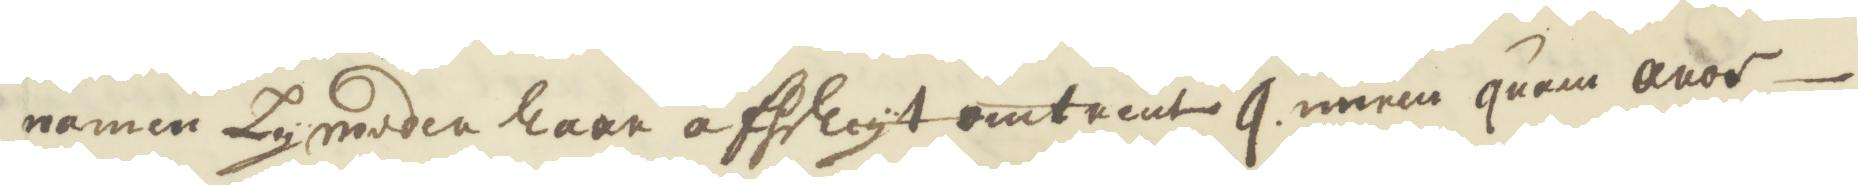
namen zij weder haar afscheijt omtrent 4. uuren quam aroe —
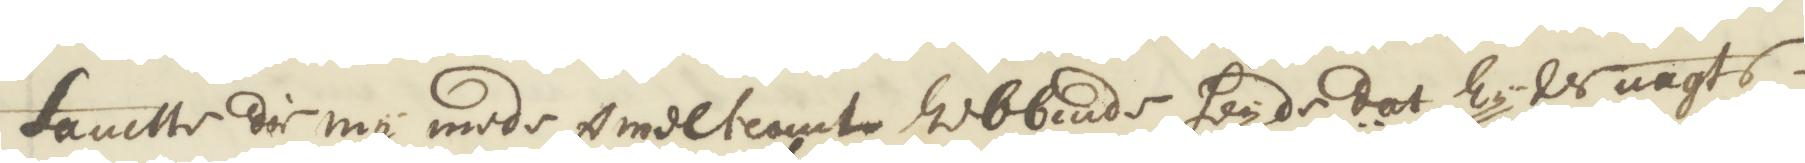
tanette die mij mede verwelkomt hebbende seijde dat hij des nagts
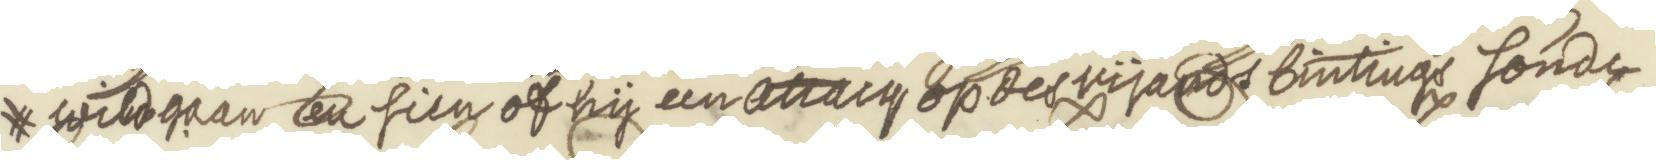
# wild gaan en sien of hij een attacq op de vijands bintings soude
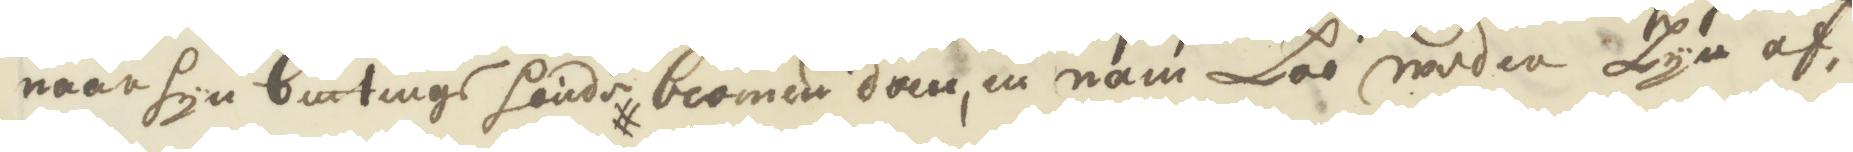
naar sijn bintings soude # komen doen, en nam zoo weder zijn af„
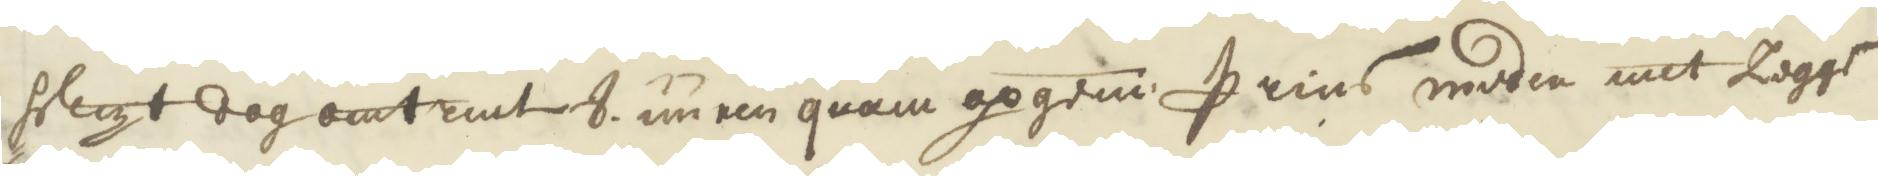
„scheijt dog omtrent 8. uuren quam opgem: prins weder met zegge
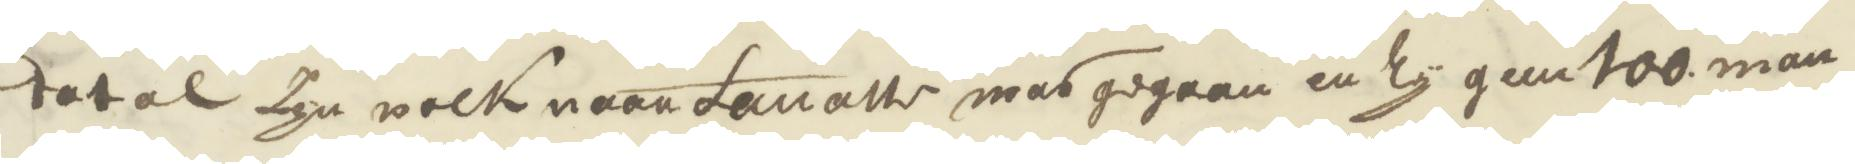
dat al zijn volk naar tanatte was gegaan en hij geen 100. man
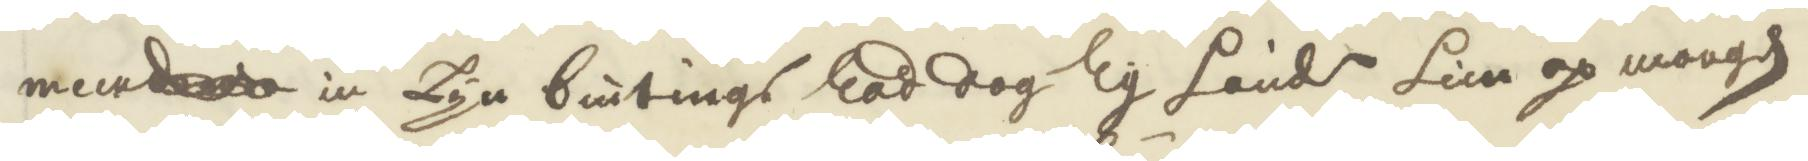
meerde in zijn bintings had dog hij soude sien op morgen
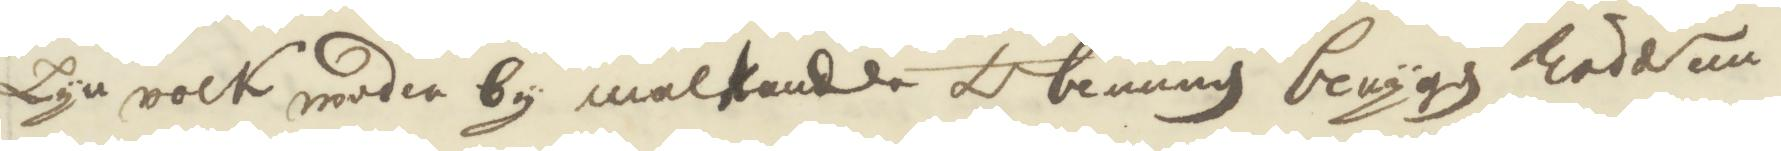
zijn volk weder bij malkander te kunnen krijgen hadde een
